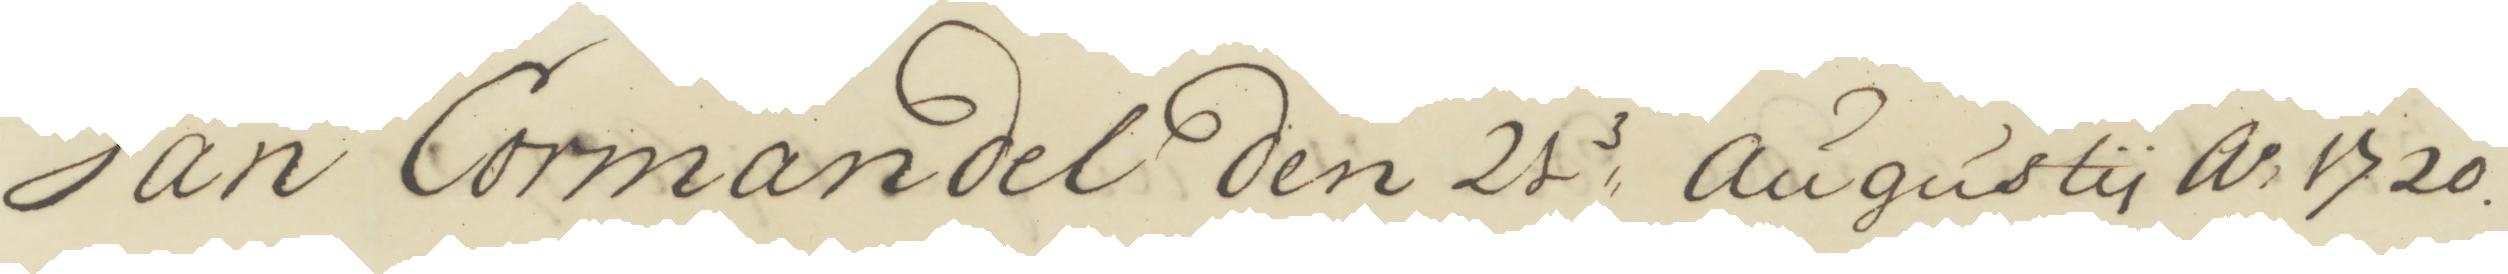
Van Cormandel den 21„e Augustij A:o 1720.
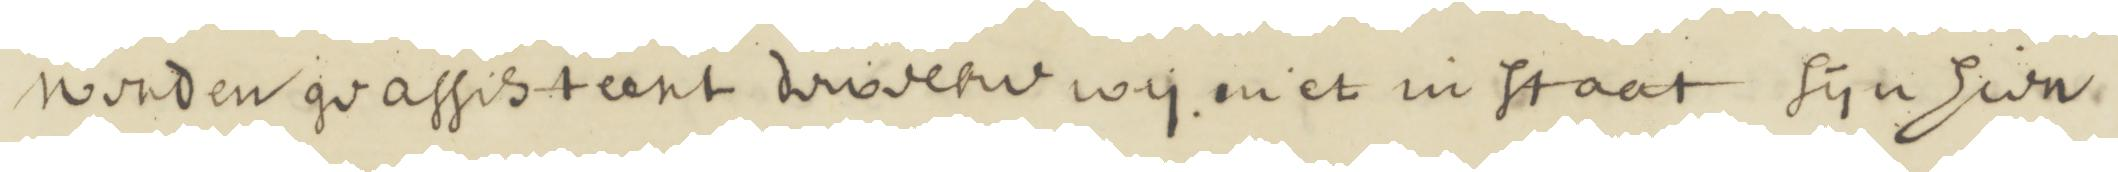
werden geassisteert dewelke wij niet in staat sijn hier
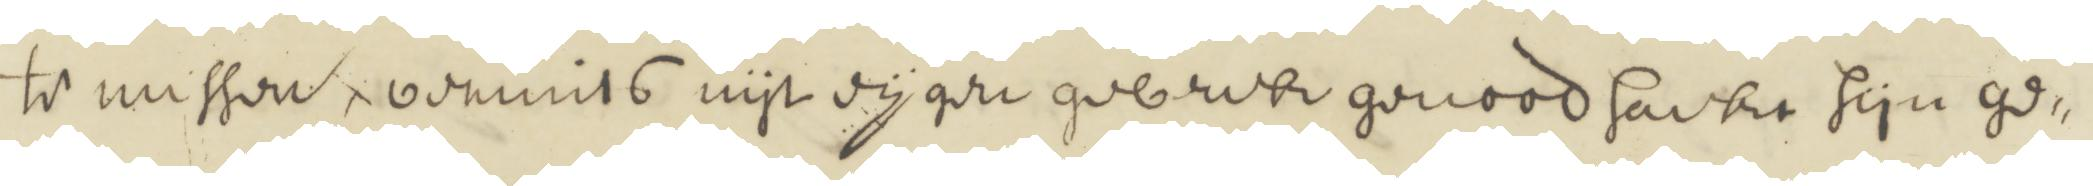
te missen vermits uijt eijgen gebrek genoodsaekt sijn ge„
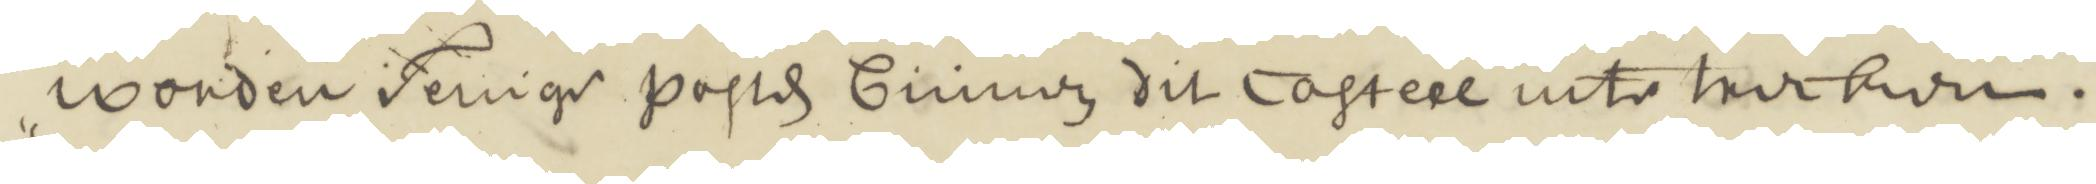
„worden Eenige posten binnen dit casteel inte trecken.
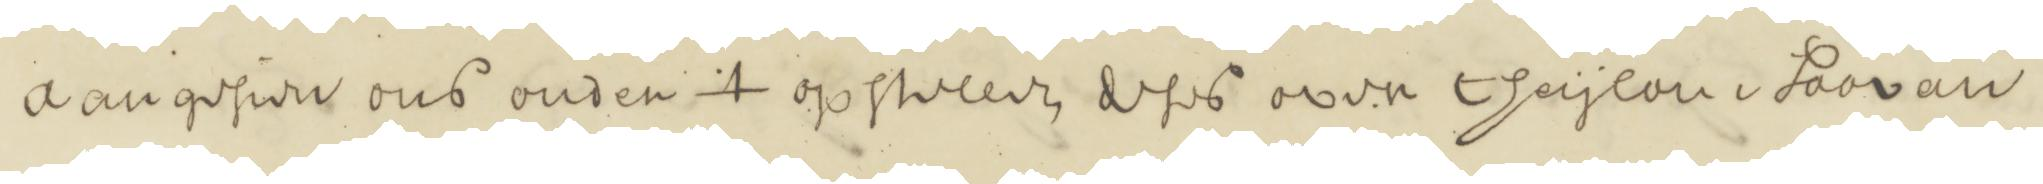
aangesien ons onder ’t opstellen deses over Cheijlon soovan
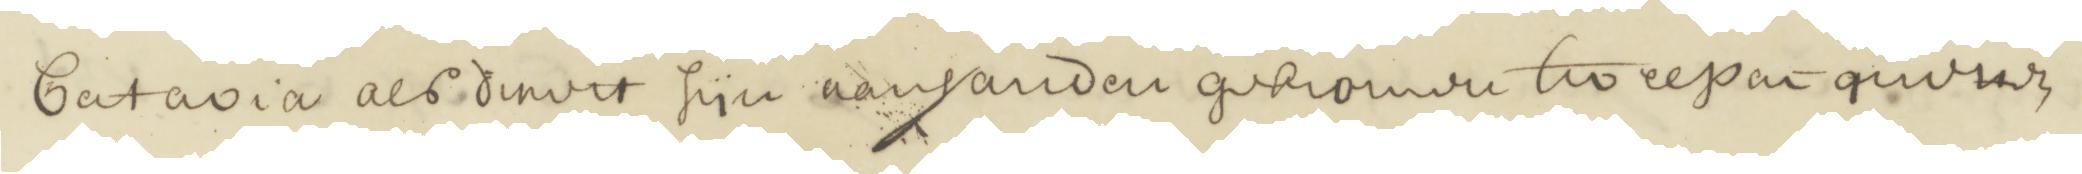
batavia als direct sijn aanhanden gekomen twee pacquetten
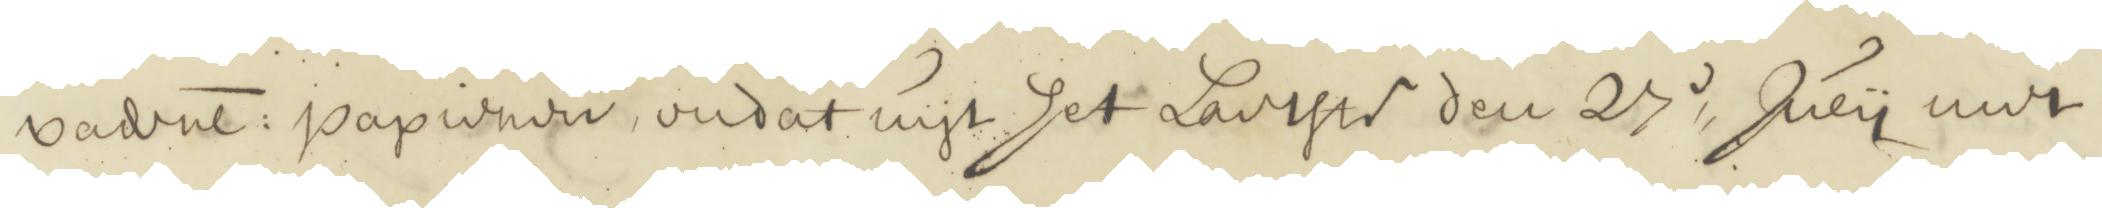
vaderl: papieren, endat uijt het laetste den 27„e Julij met
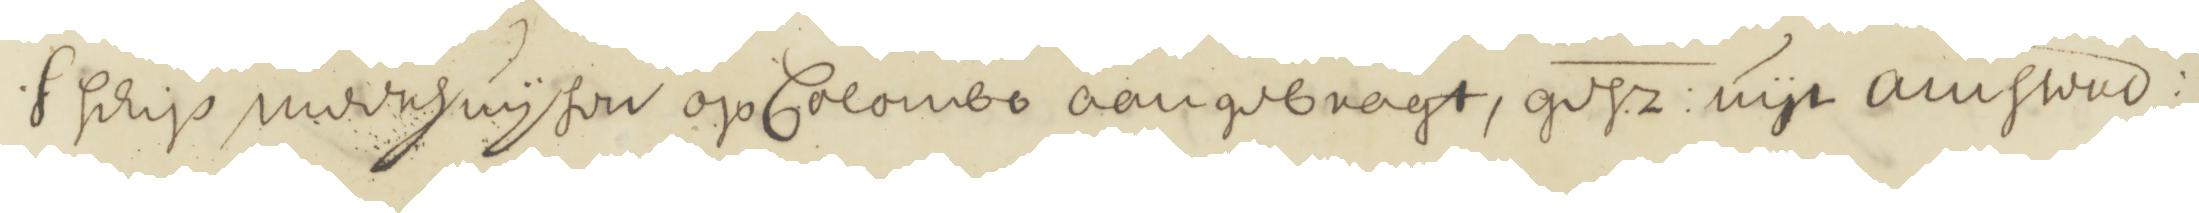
’t schip meerhuijsen op Colombo aangebragt, gesz: uijt amsterd:
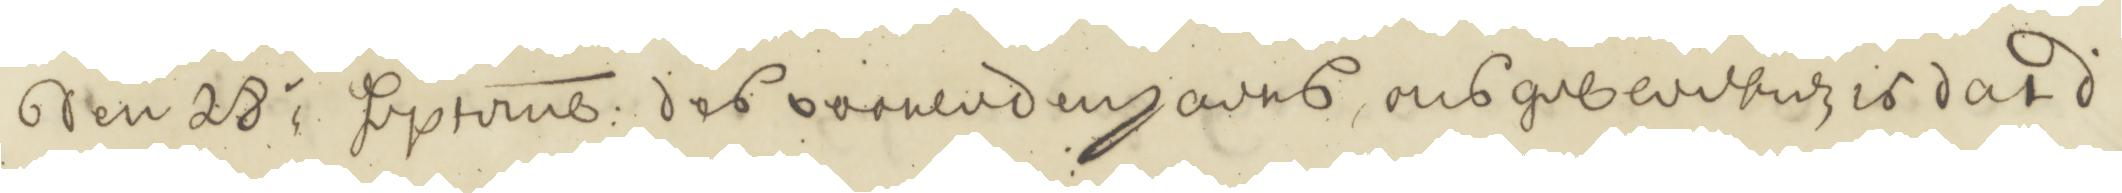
den 28„e septemb: des voorleden jaers, ons gebleeken is dat d’
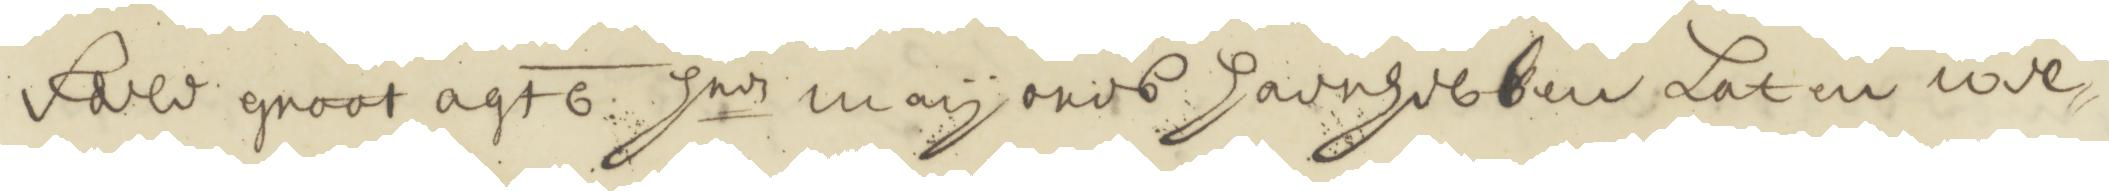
Edele groot agtb: h=ren maijores haer hebben Laten wel„
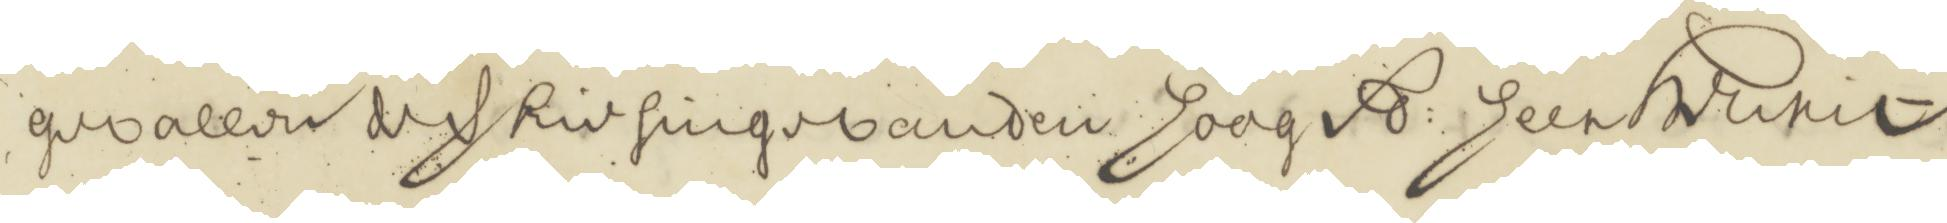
gevallen de verkiesinge vanden Hoog Ed: heer Henric
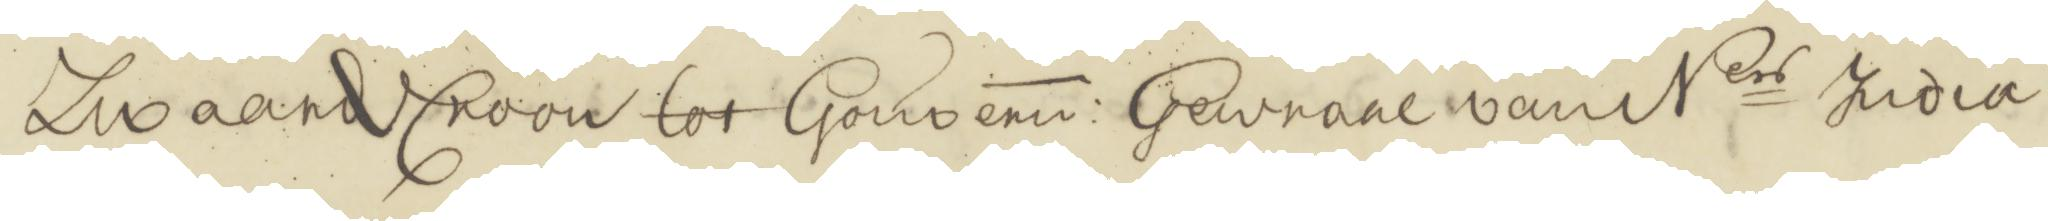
Zwaardecroon tot Gouvern: Generaal van N=ers India
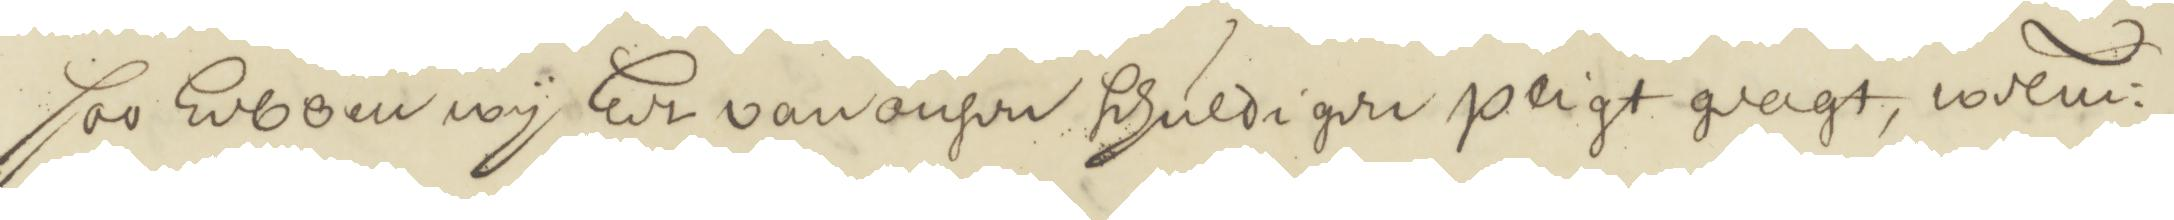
soo hebben wij het van onsen schuldigen pligt geagt, welm:
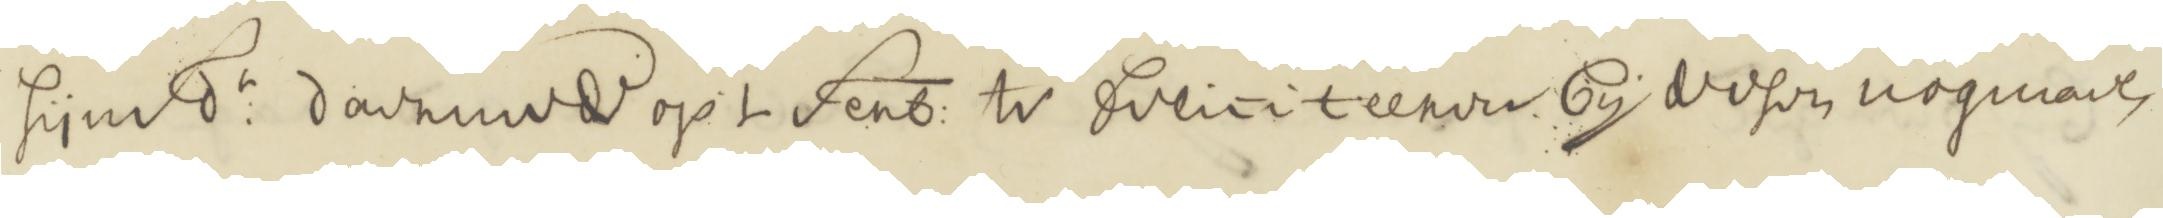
sijn Ed:t daermede op ’t Eerb: te feliciteeren bij deesen nogmael,
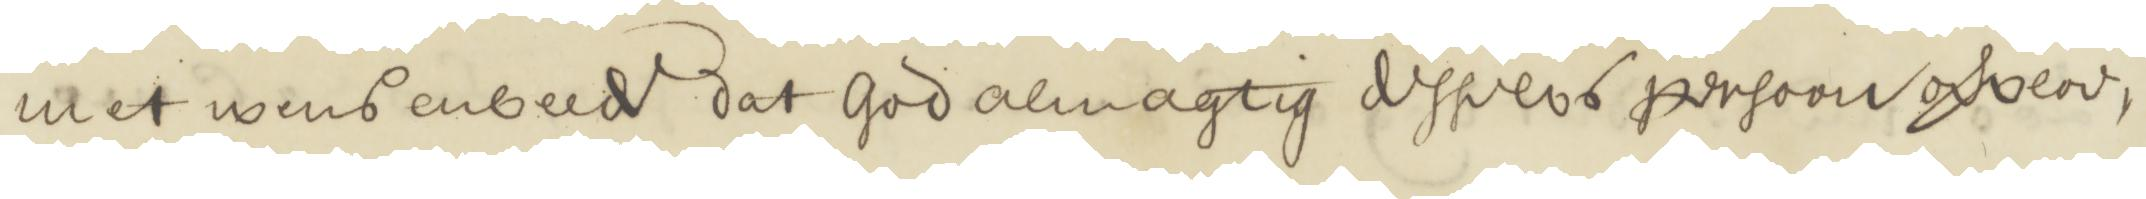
met wens en beede dat god almagtig desselvs persoon overvloe„
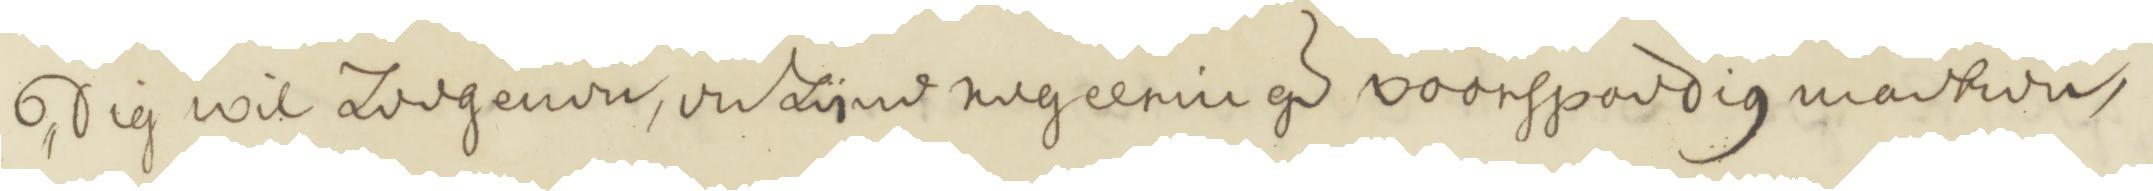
dig wil zeegenen, en zijne regeeringe voorspoedig maeken,
